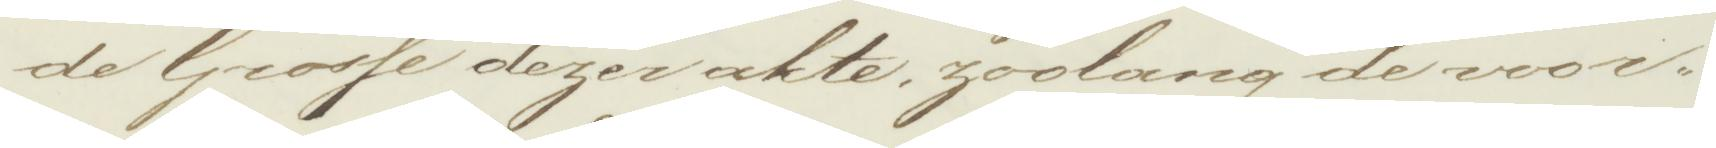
de Grosse dezer akte, zoolang de voor„
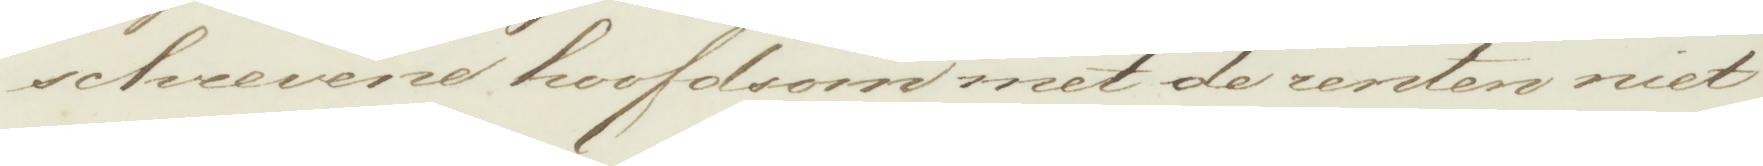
schrevene hoofdsom met de renten niet
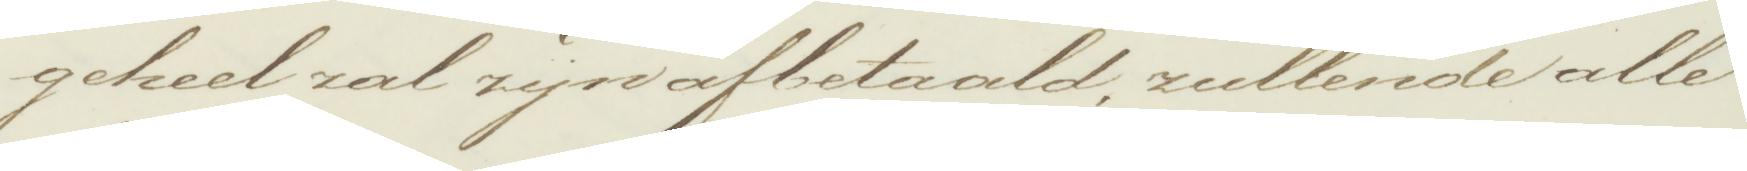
geheel zal zijn afbetaald, zullende alle
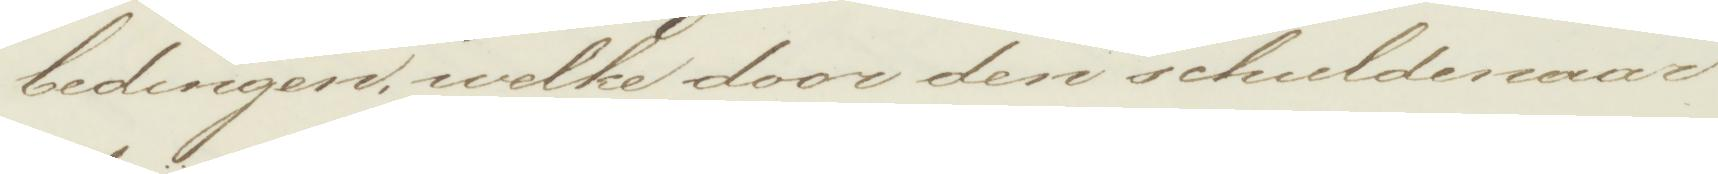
bedingen, welke door den schuldenaar
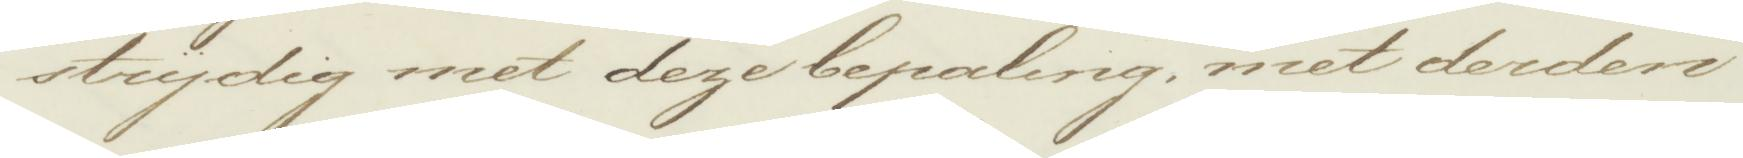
strijdig met deze bepaling, met derden
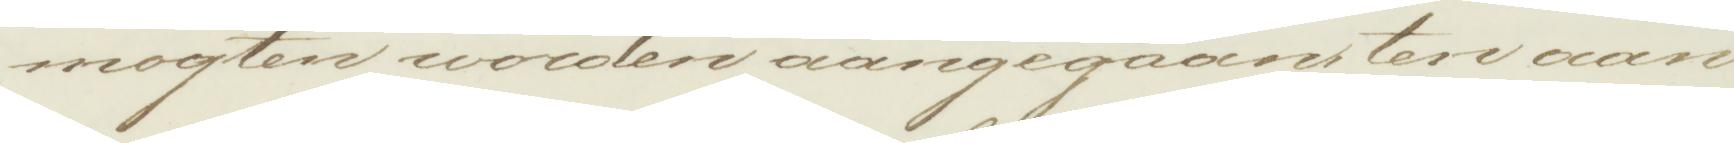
mogten worden aangegaan, ten aan
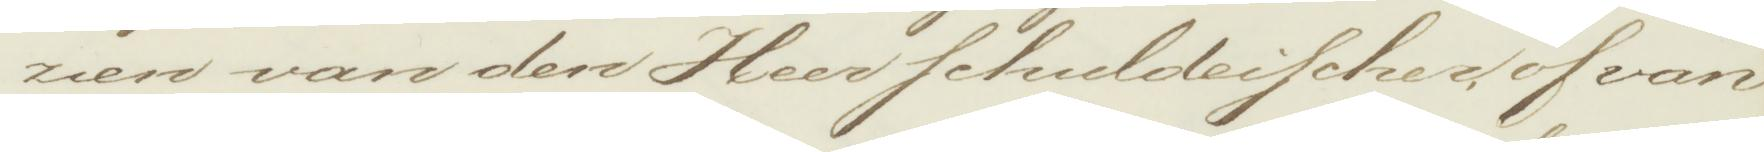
zien van den Heer schuldeischer, of van
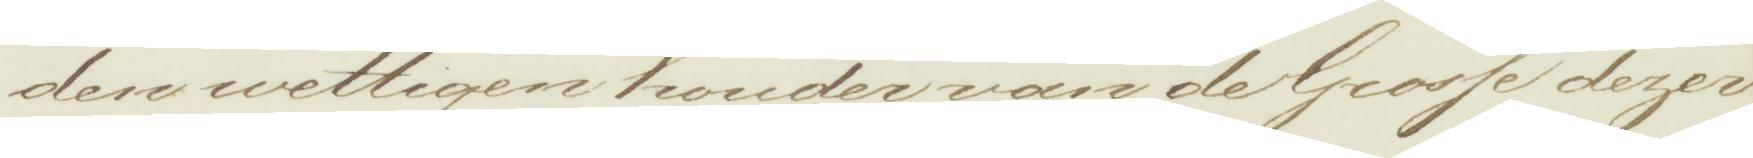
den wettigen houder van de Grosse dezer
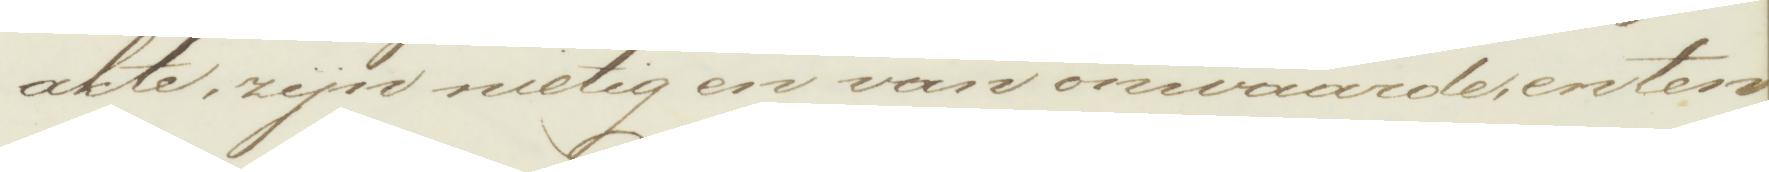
akte, zijn nietig en van onwaarde, en ten
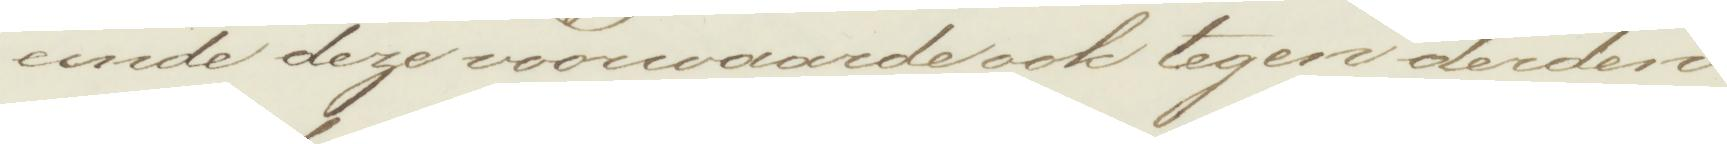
einde deze voorwaarde ook tegen derden
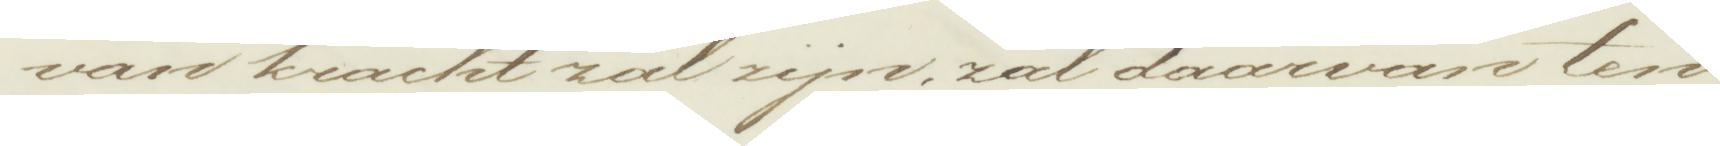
van kracht zal zijn, zal daarvan ten
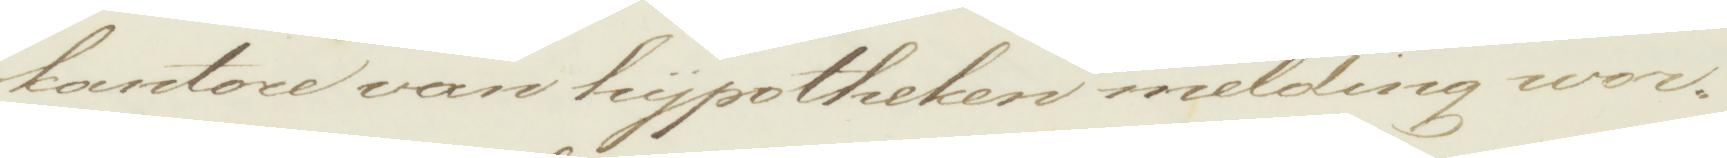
kantore van hijpotheken melding wor„
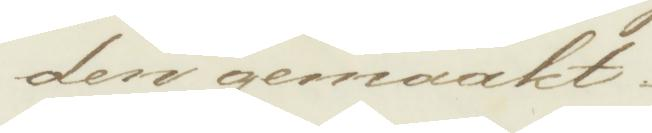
den gemaakt
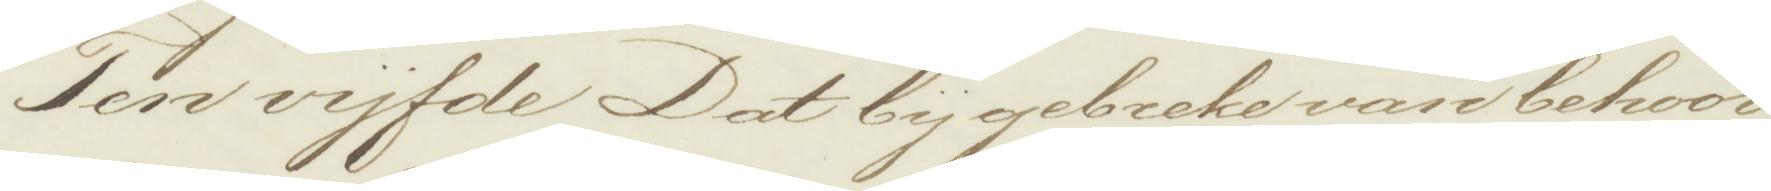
Ten vijfde Dat bij gebreke van behoor
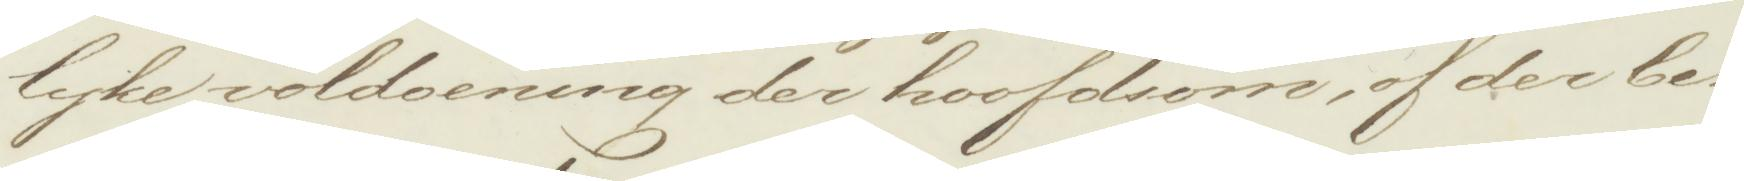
lyke voldoening der hoofdsom, of der be„
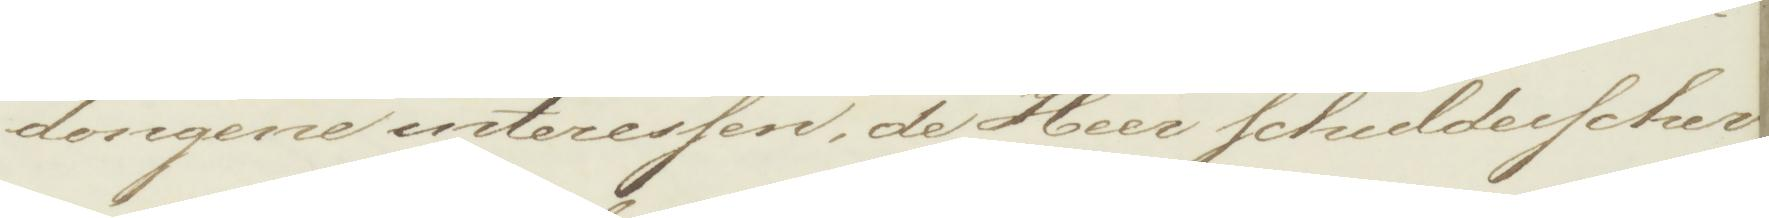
dongene interessen, de Heer schuldeischer
